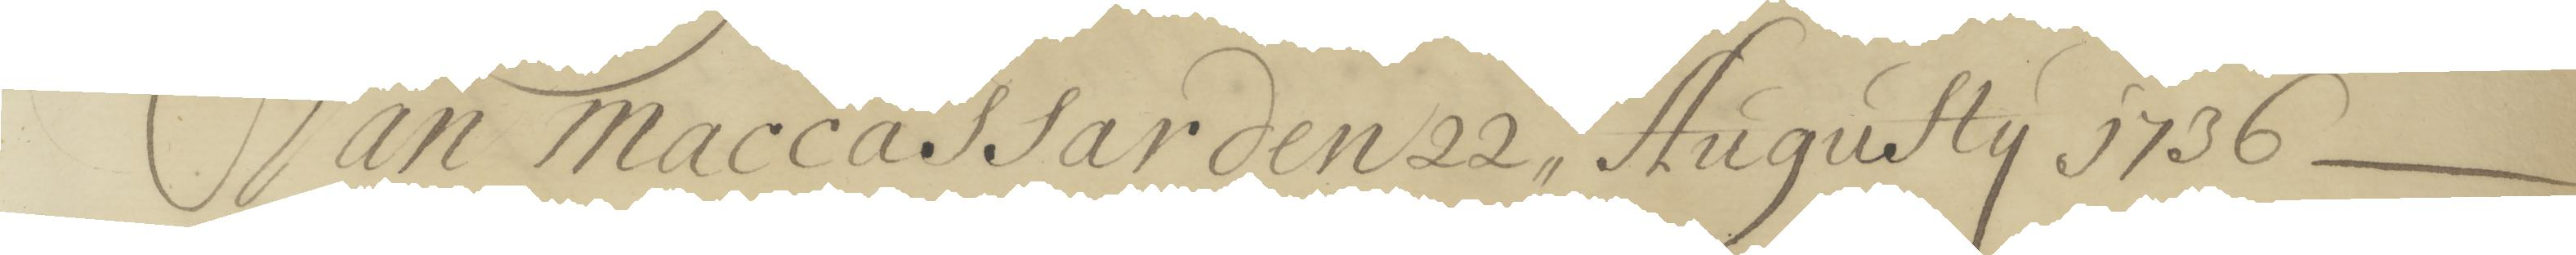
Van Maccassar den 22„' Augustij 1736 —
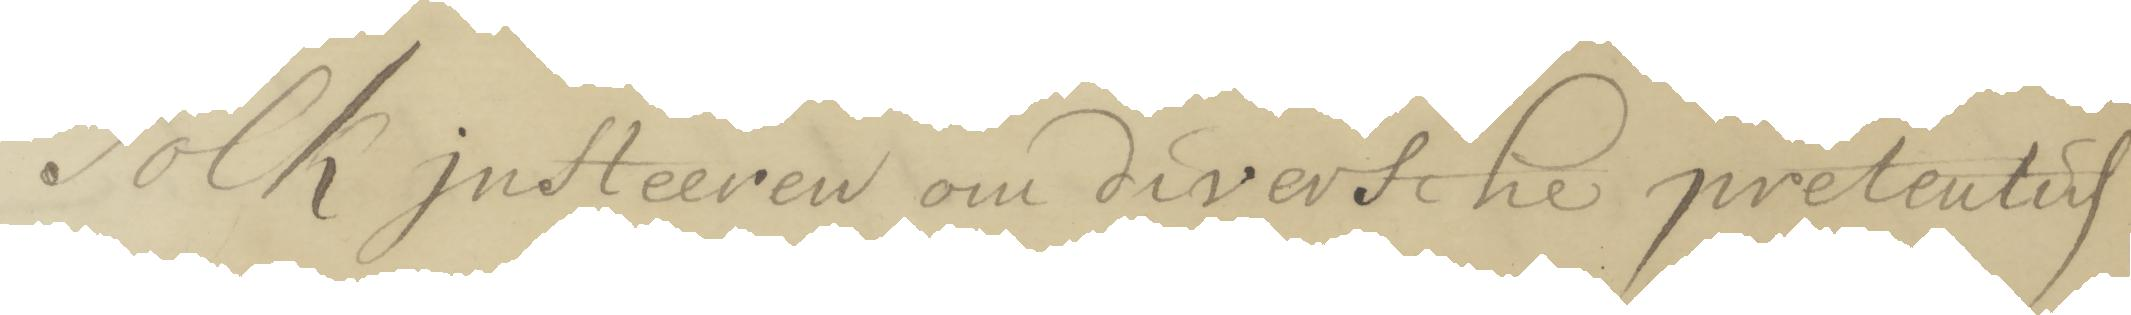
Tolk jnsteeren om diversche pretentien
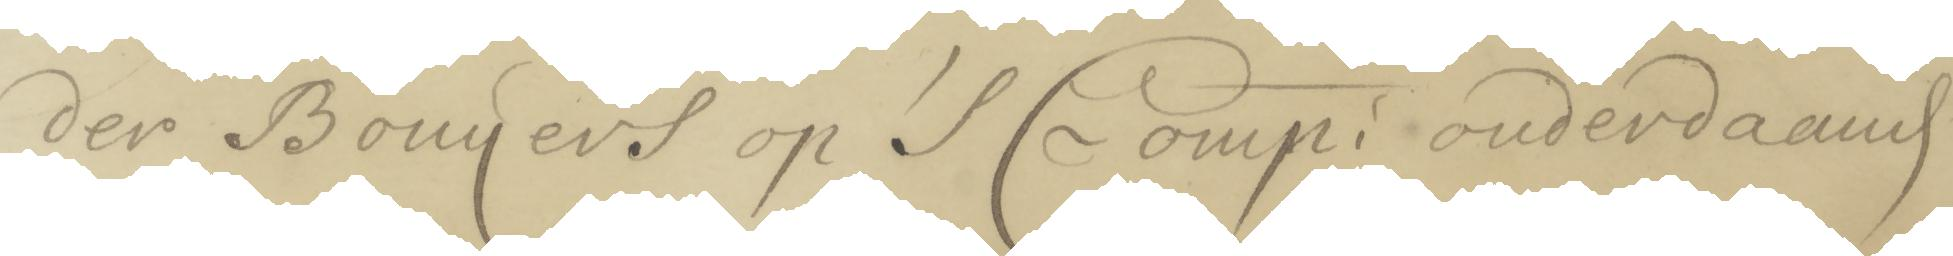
der Bouijers op ’s Comp: onderdaanen
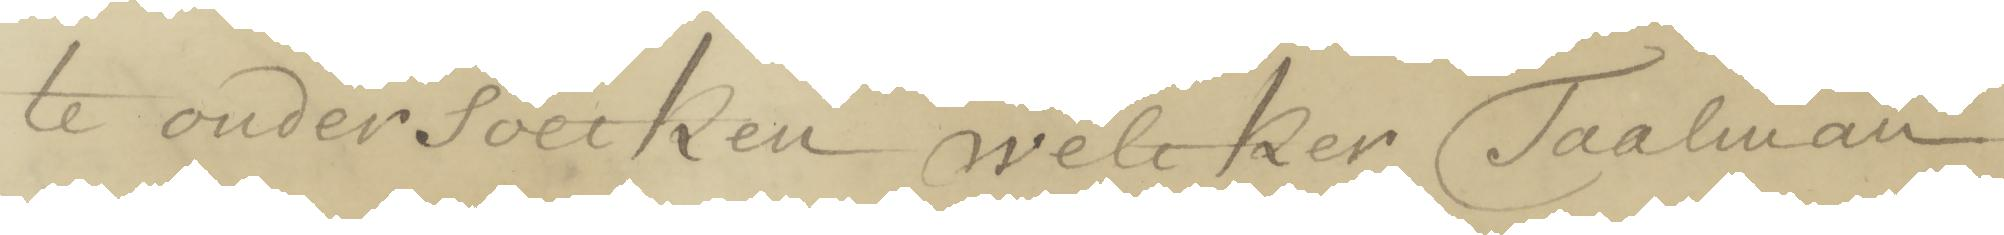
te ondersoecken welcker Taalman
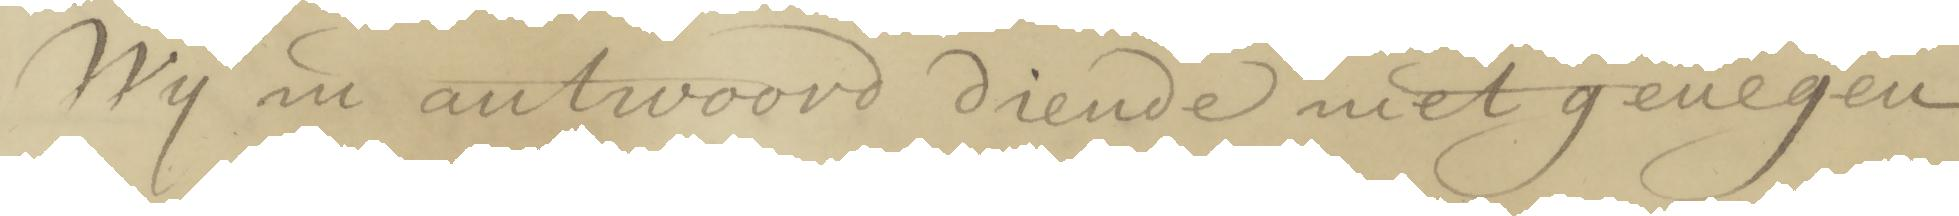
wij in antwoord diende niet genegen
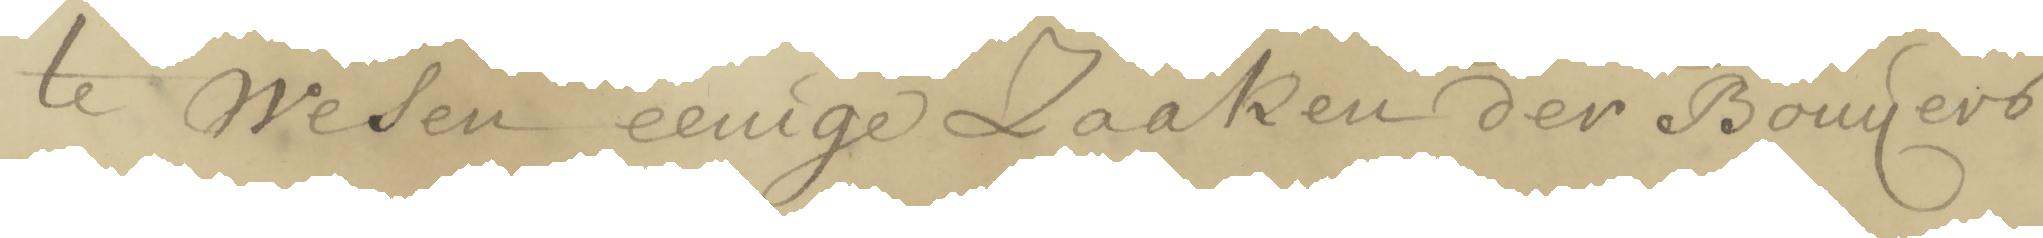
te wesen eenige zaaken der Bouijers
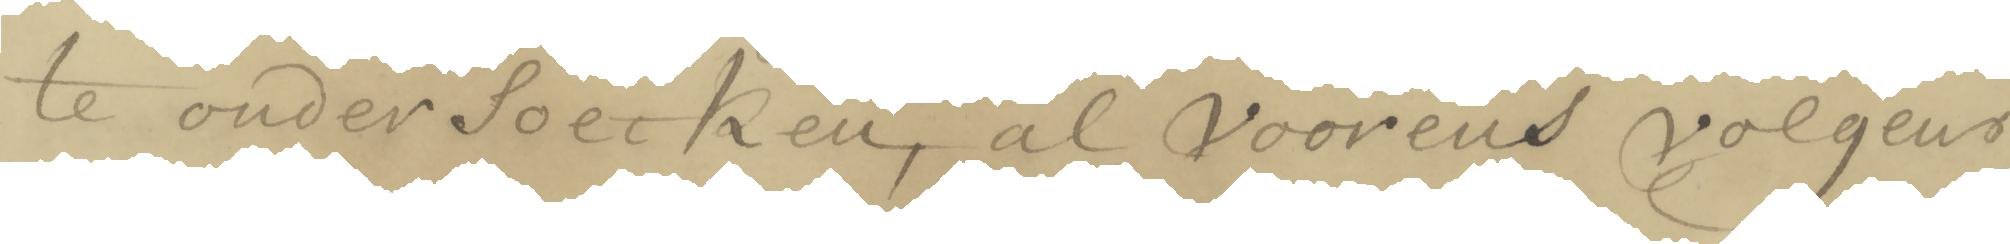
te ondersoecken, al voorens volgens
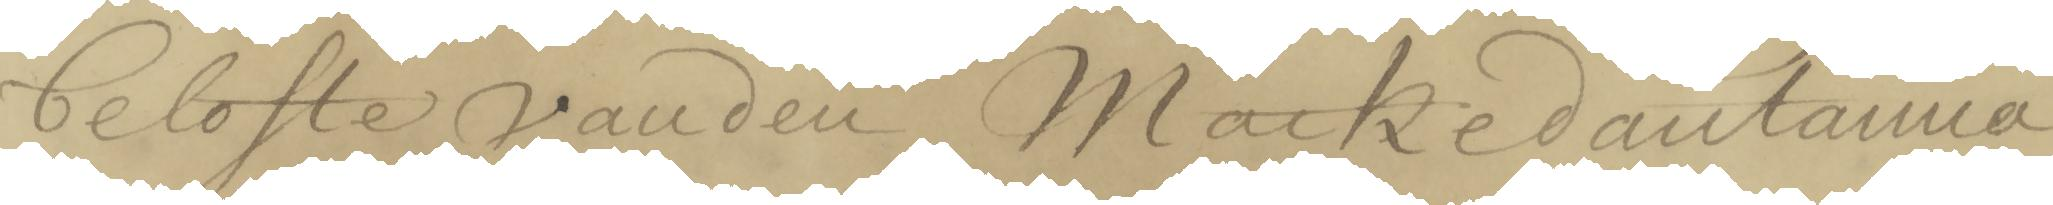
belofte van den Mackedantanna
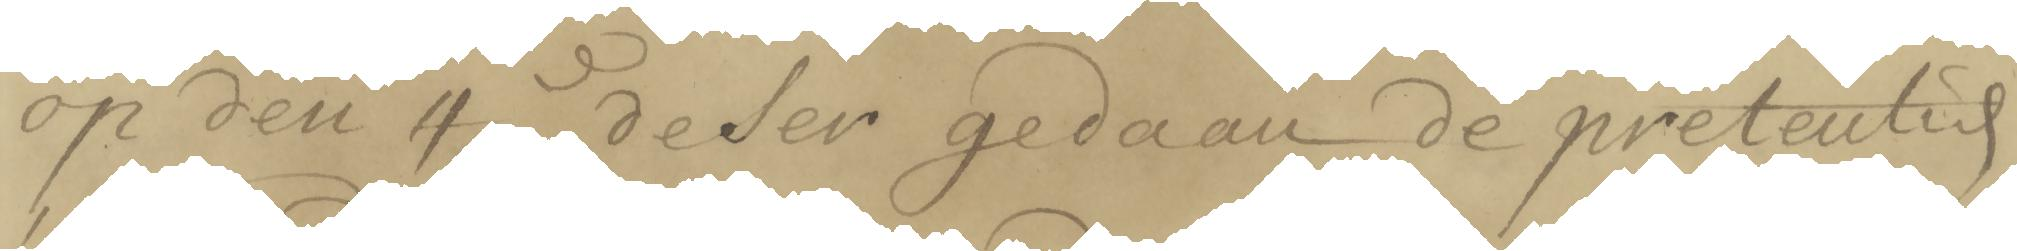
op den 4„' deser gedaan de pretentien
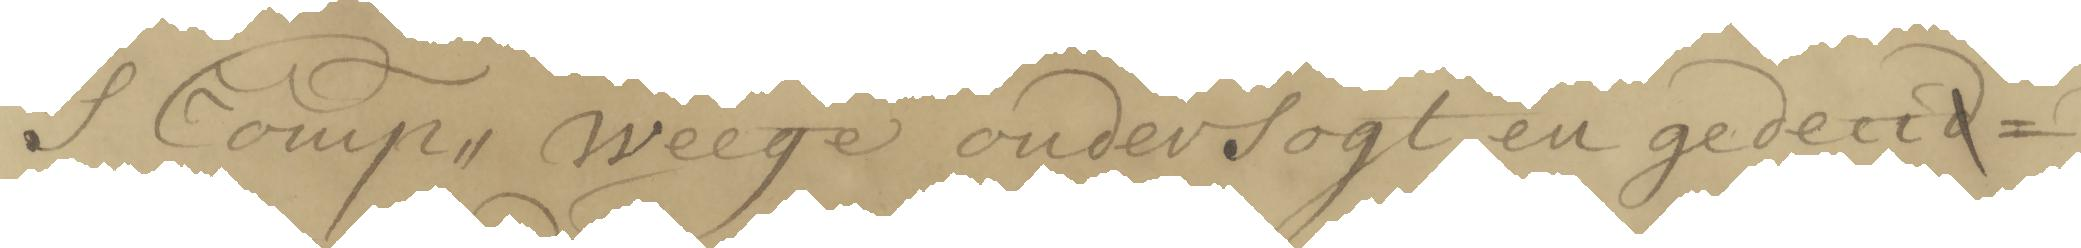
's Comp„ weege ondersogt, en gedecid=
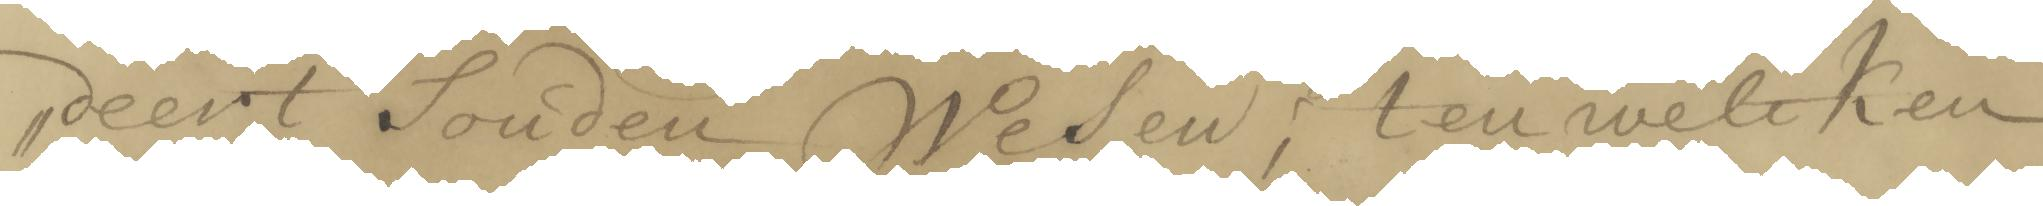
„deert souden wesen; ten welcken
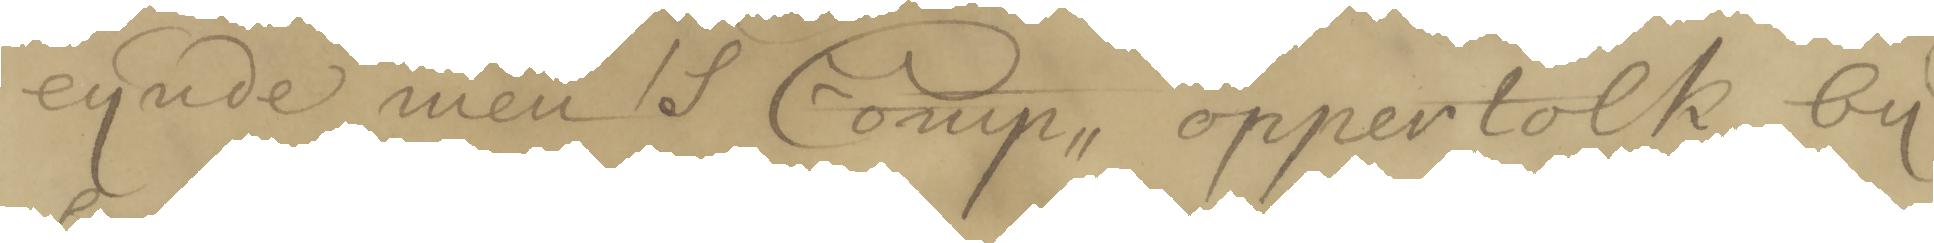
eijnde men ’s Comp„ oppertolk bij
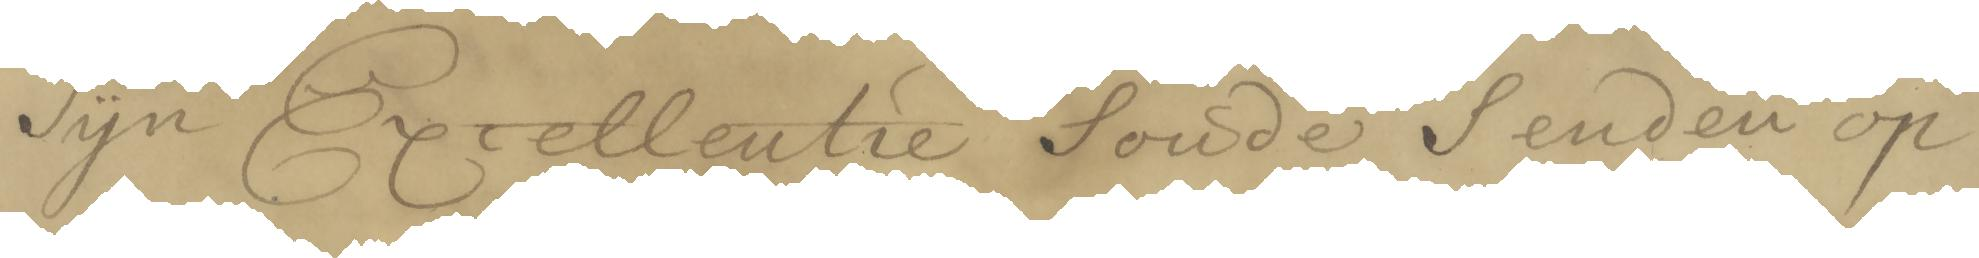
sijn Excellentie soude senden op
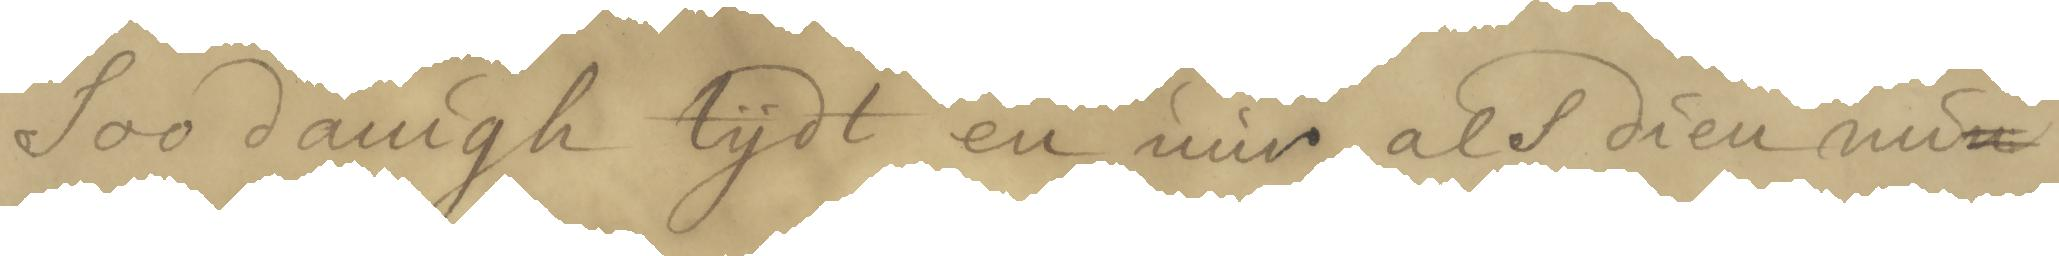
soo danigh tijdt en uur als dien min
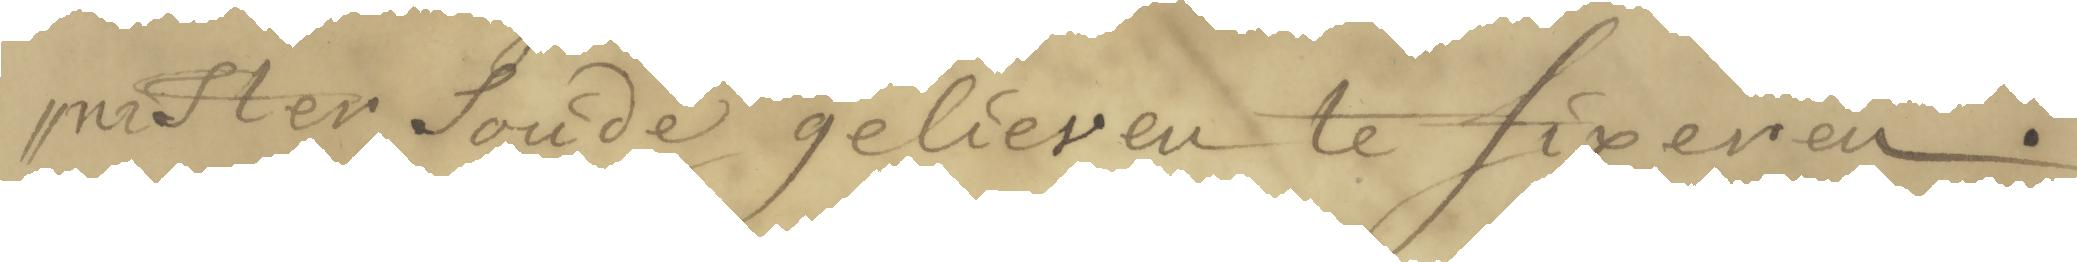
„nister soude gelieven te fixeren.
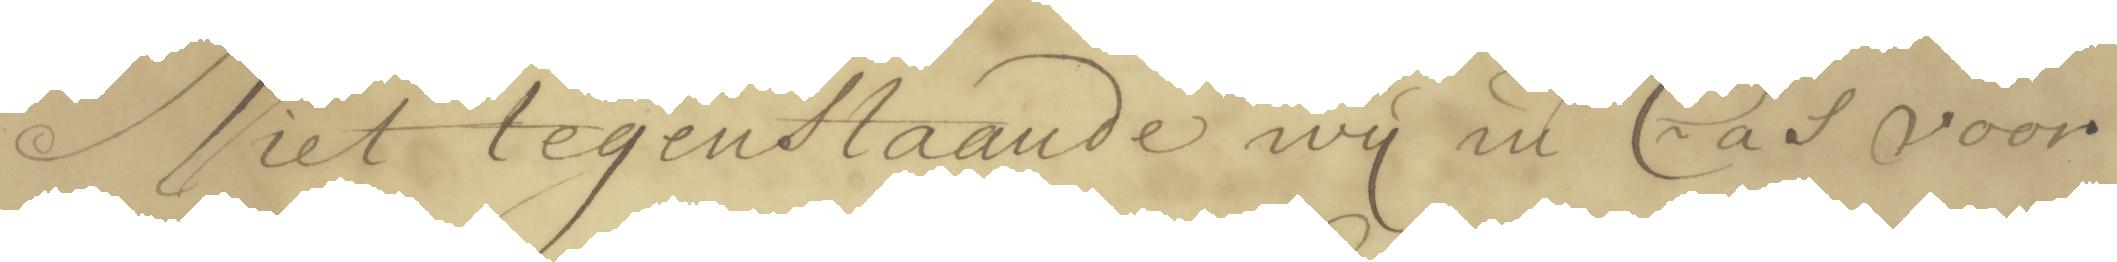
Niet tegenstaande wij in Cas voor
